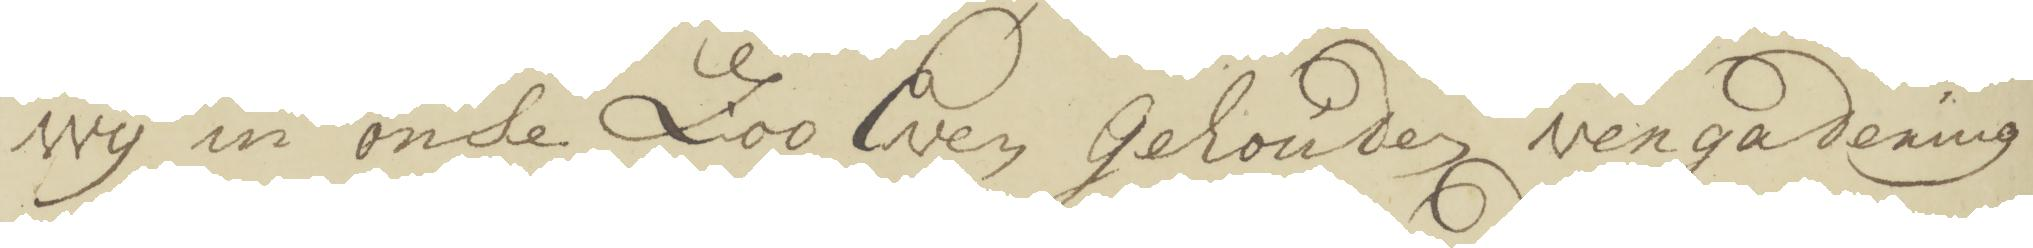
wij in onse zoo Even gehouden vergadering
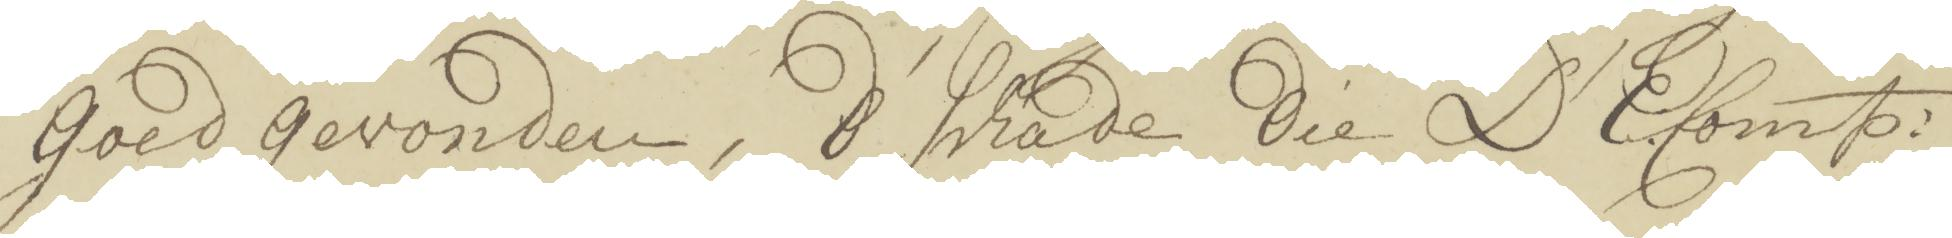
goed gevonden, d’ schade die D’EComp:
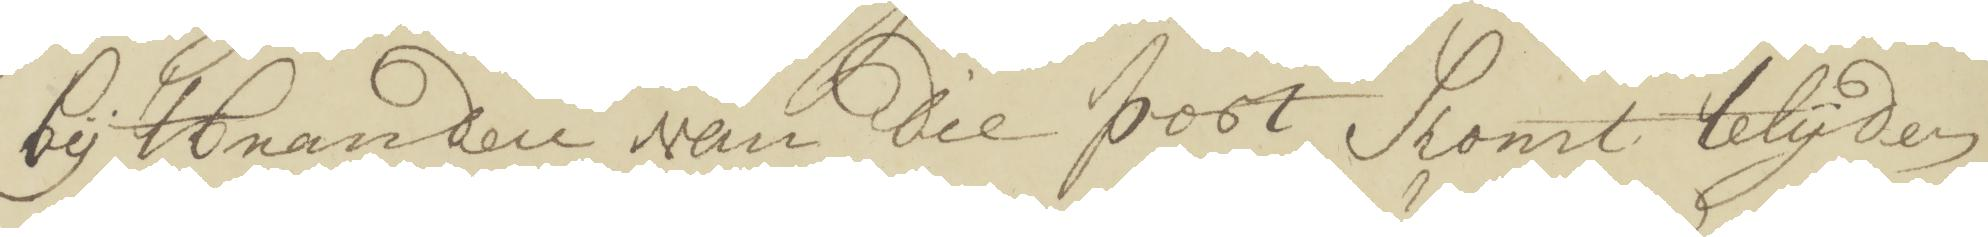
bij 'tbranden van die post komt telijden,
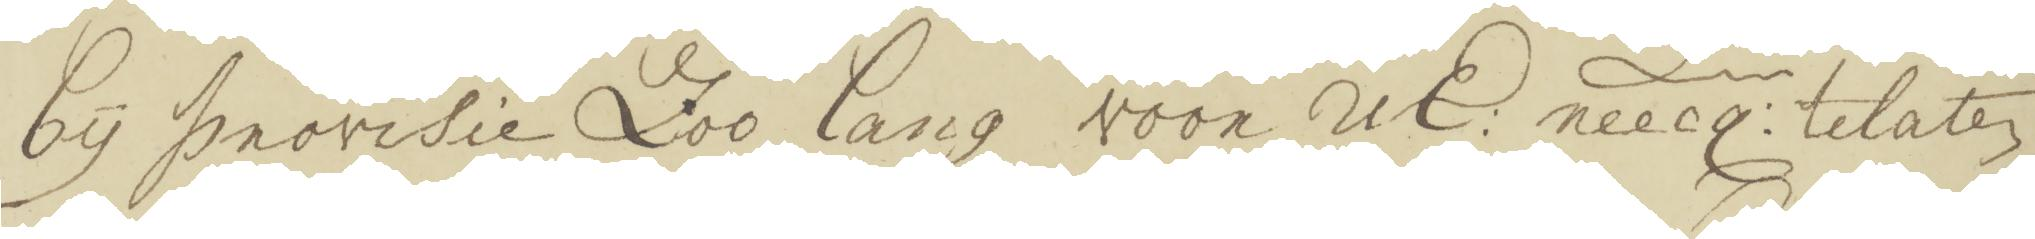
bij provisie zoo lang voor uE: reecq: telaten
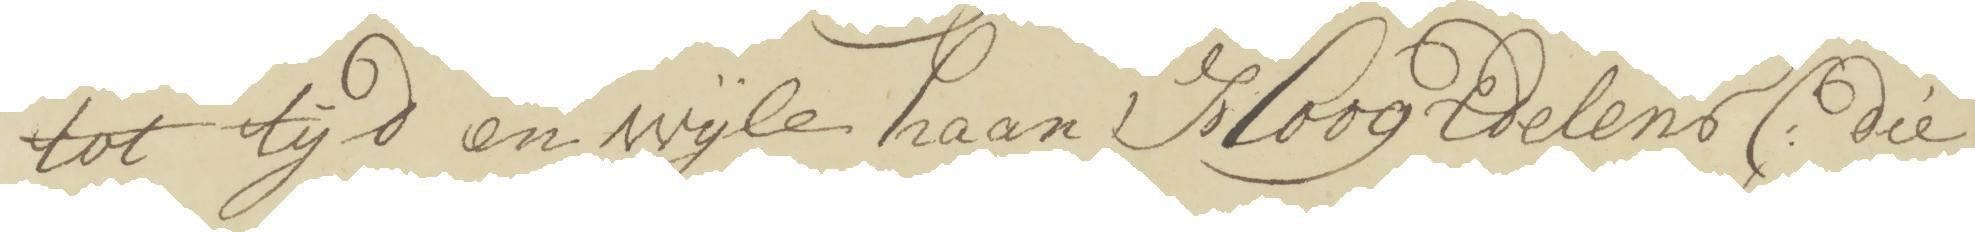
tot tijd en wijle haar Hoog Edelens (:die
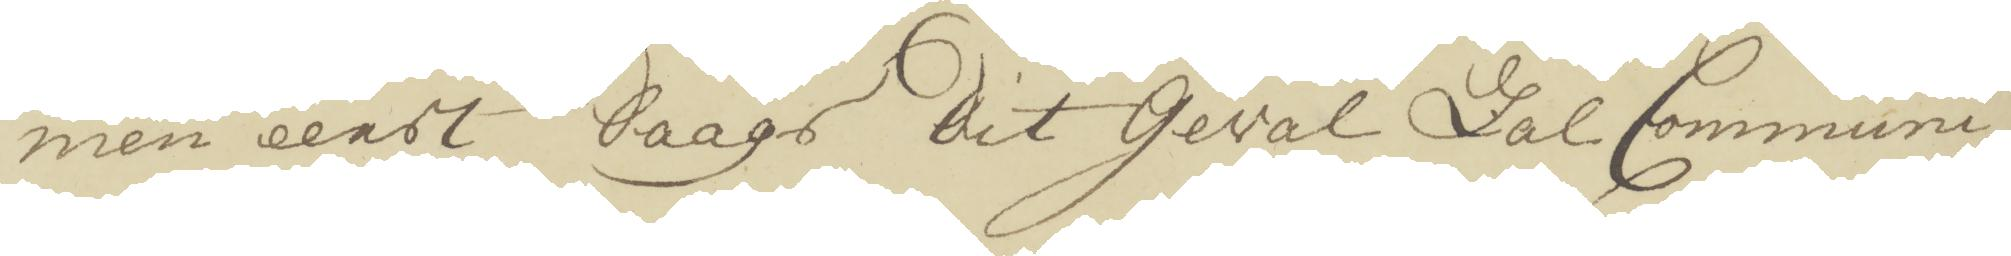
men eerst daags dit geval zal Communi
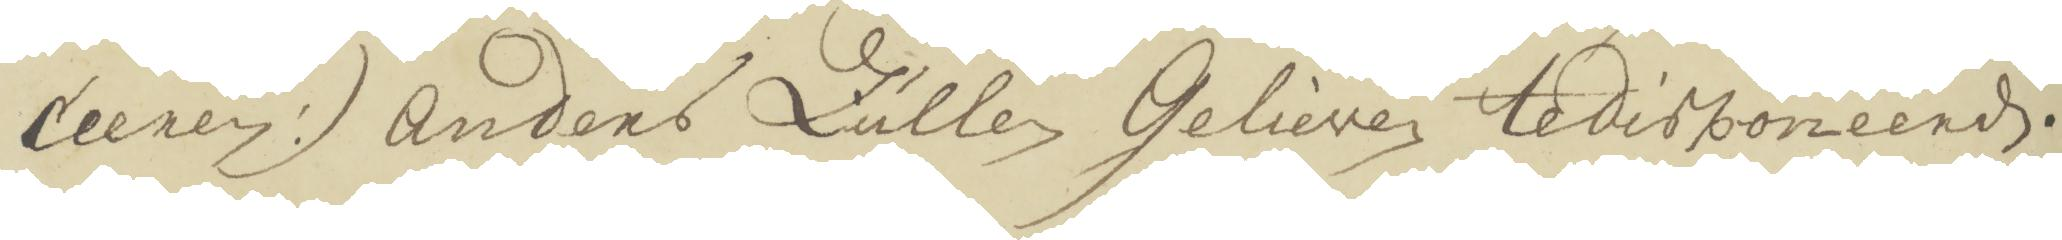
ceeren:) anders zullen gelieven te disponeeren.
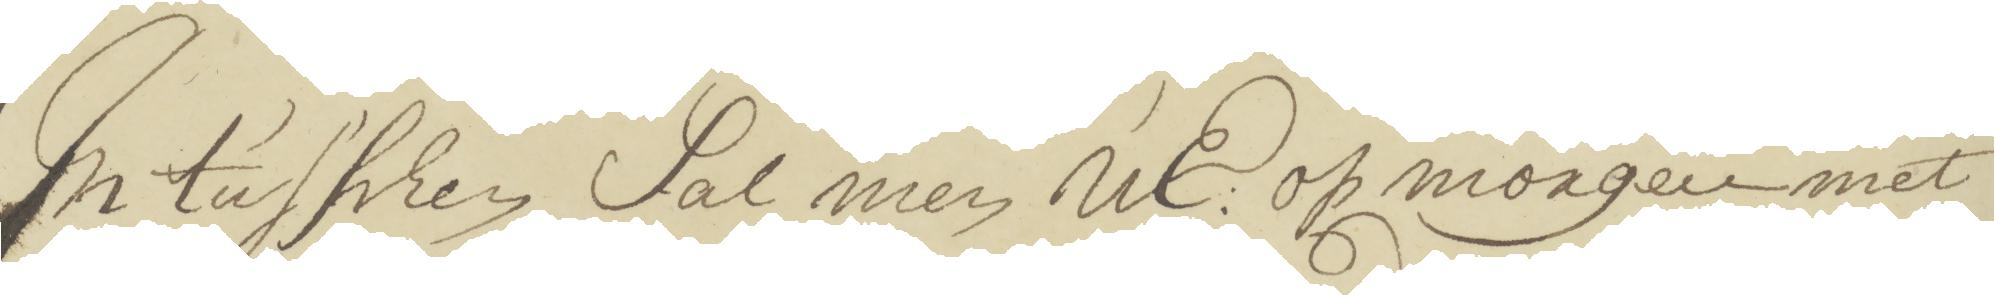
Jntusschen sal men uE: op morgen met
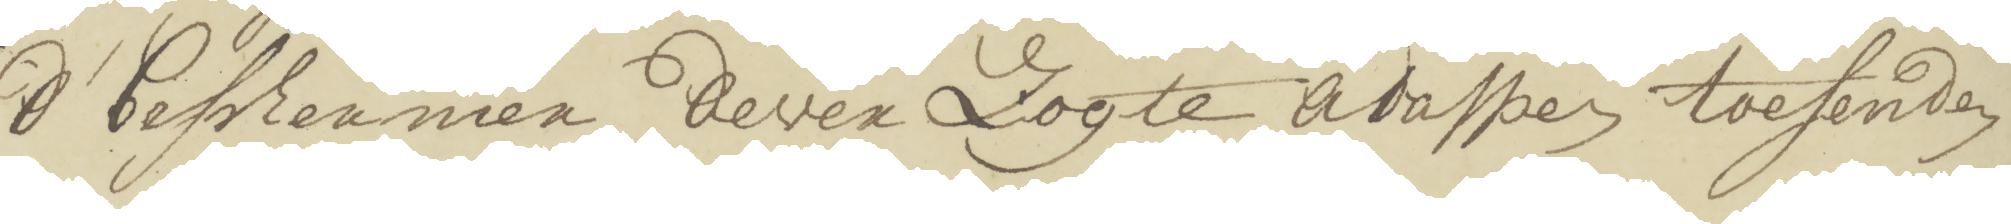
d’ beschermer dever zogte adappen toesenden
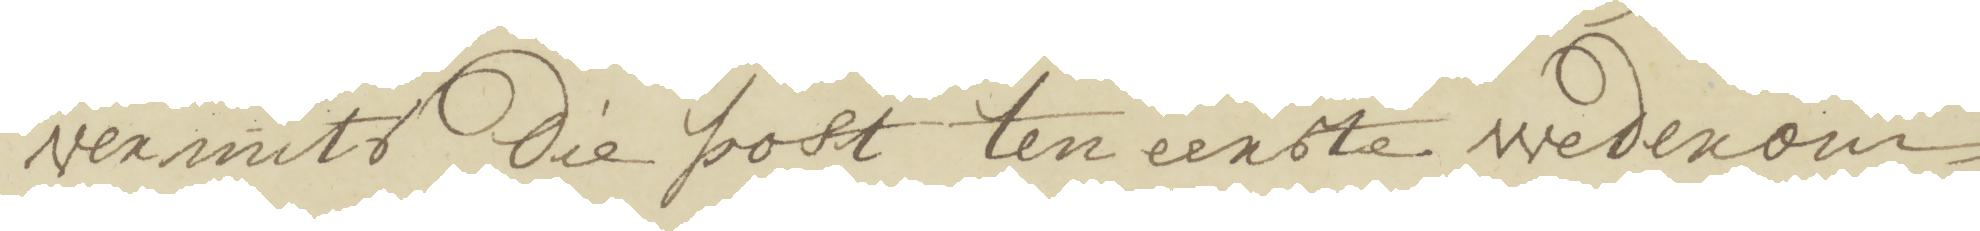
vermits die post ten eerste wederom
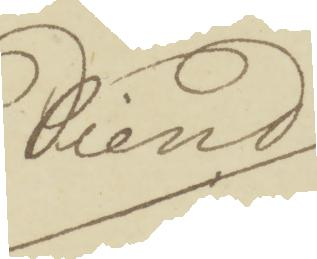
diend
